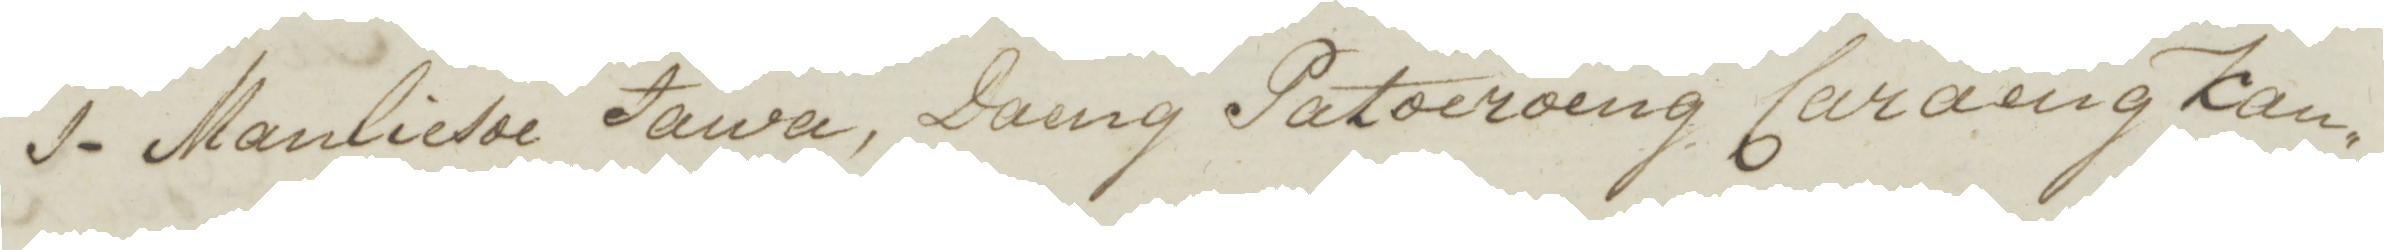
I- Manliesoe Iawa, Daeng Patoeroeng Caraeng kan„
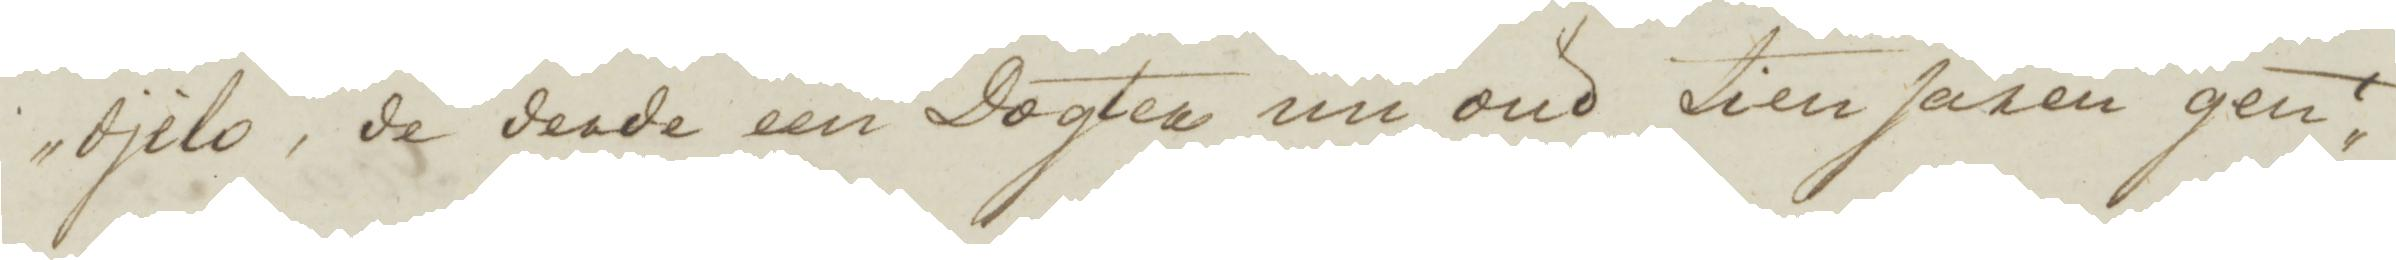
„djèlo, de derde een Dogter nu oud tien jaren gen„t
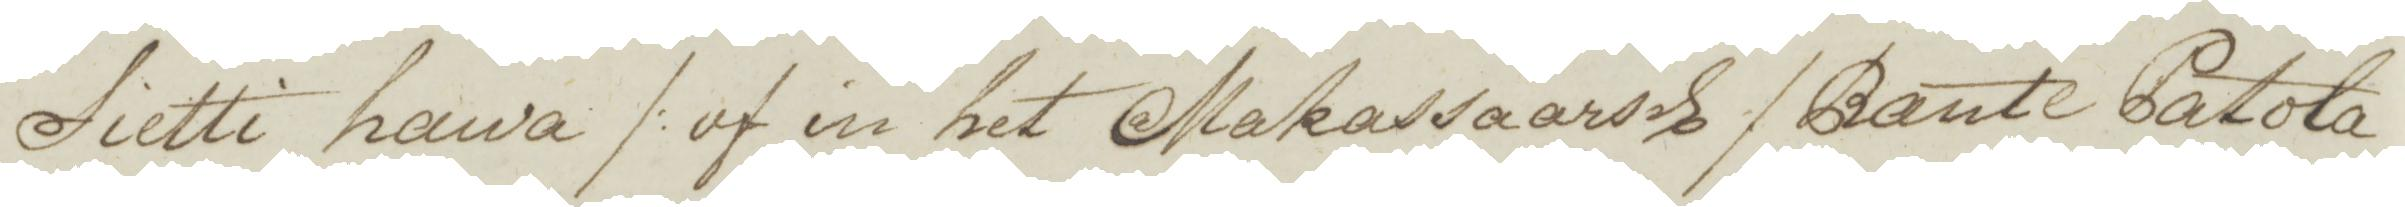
Sietti hawa /: of in het Makassaarsch :/ Bante Patola
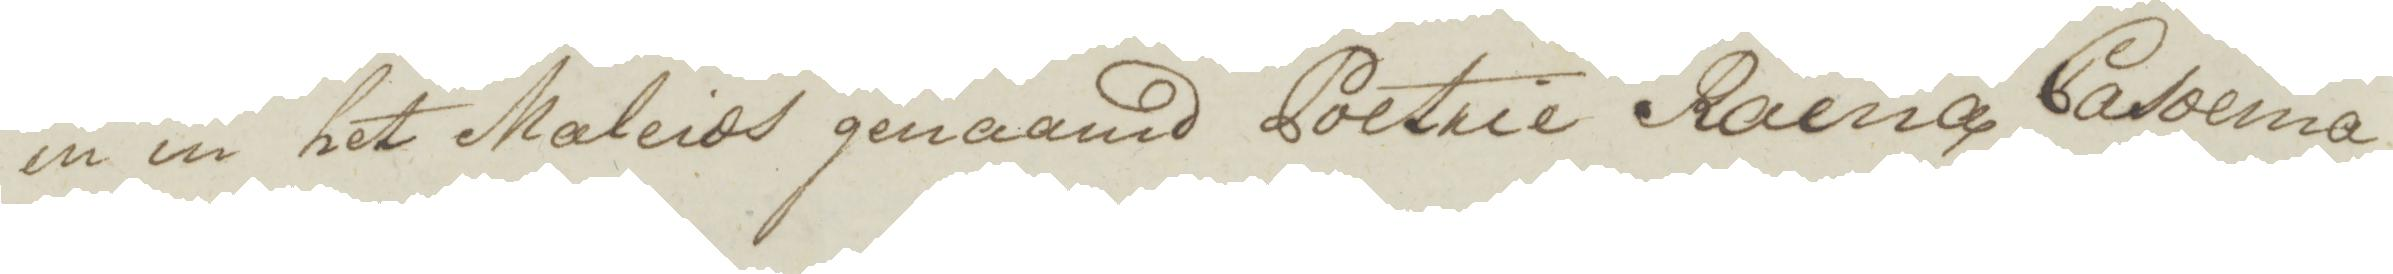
en in het Maleids genaamd Poetrie Raena Pasoema
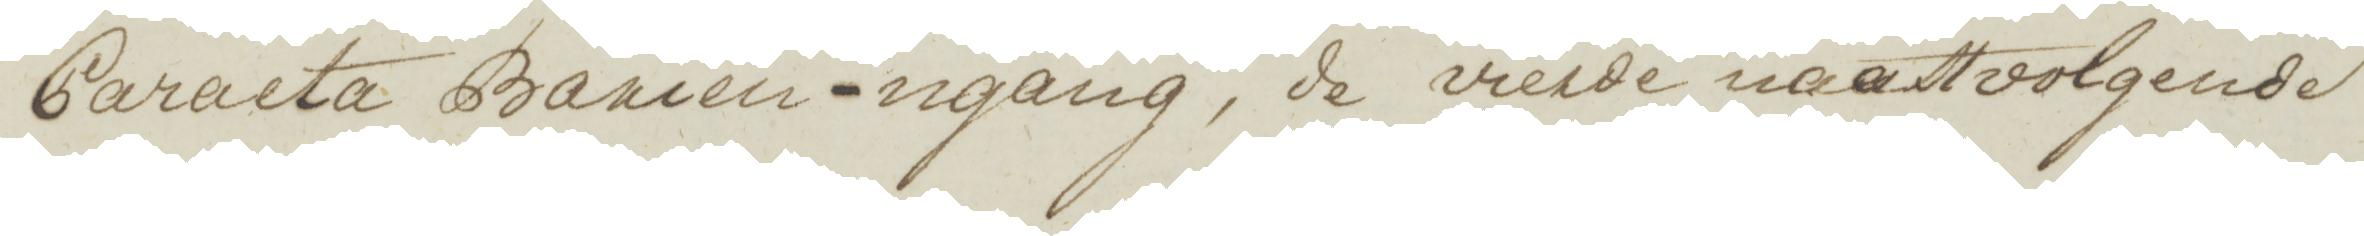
Paraeta Barien-ngang, de vierde naast volgende
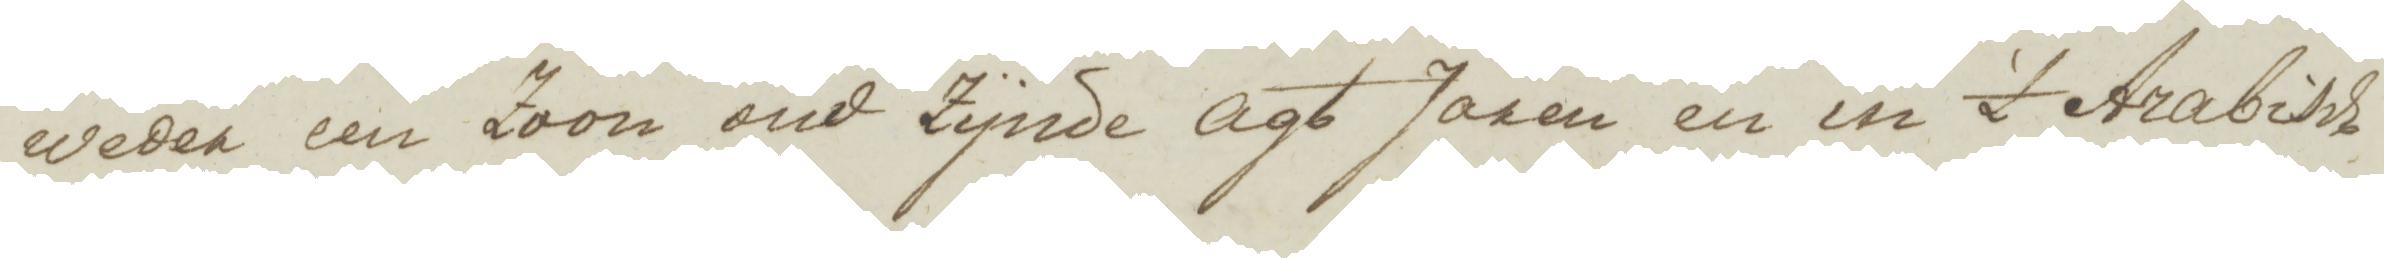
weder een zoon oud zijnde agt jaren en in ’t Arabisch
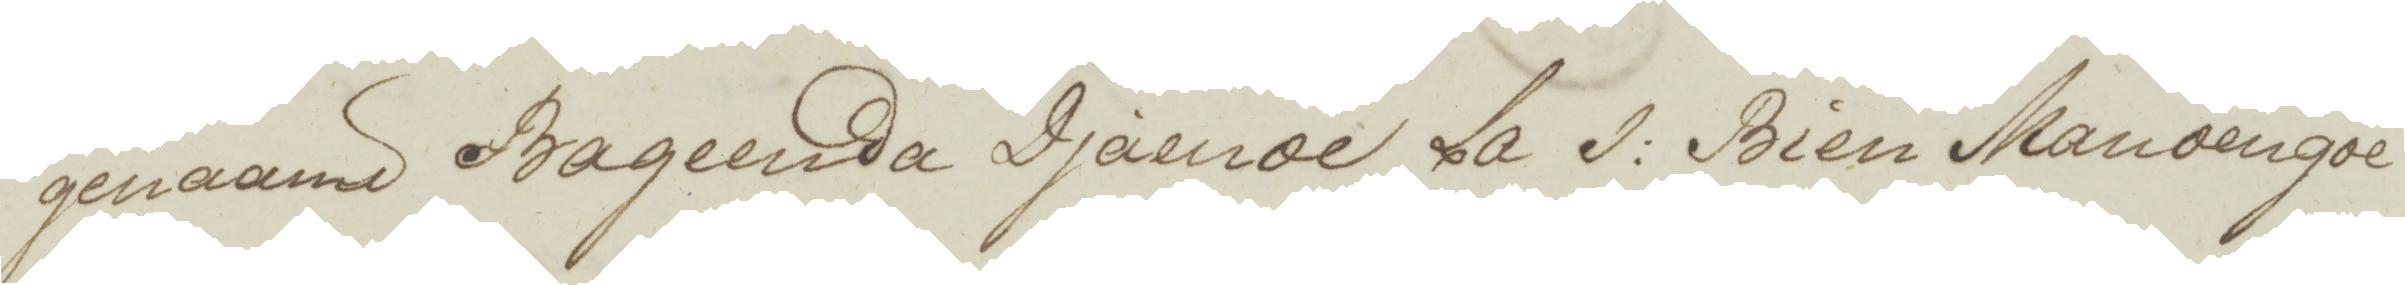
genaamd Bageenda Djaenoe La I: Bien Mandengoe
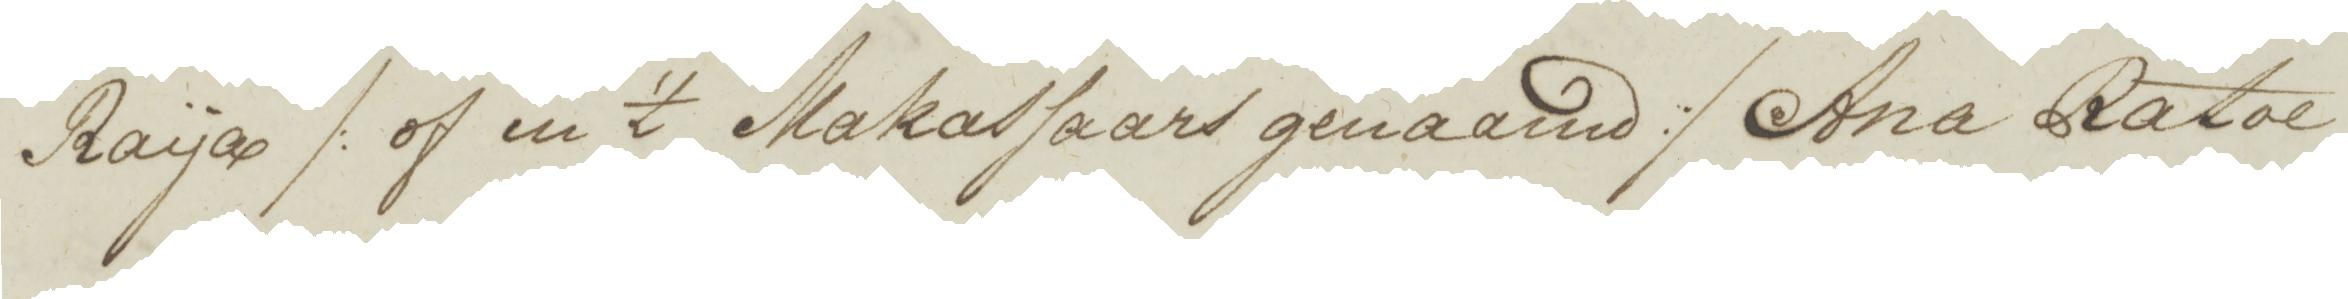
Raija /: of in ’t Makassaars genaamd :/ Ana Ratoe
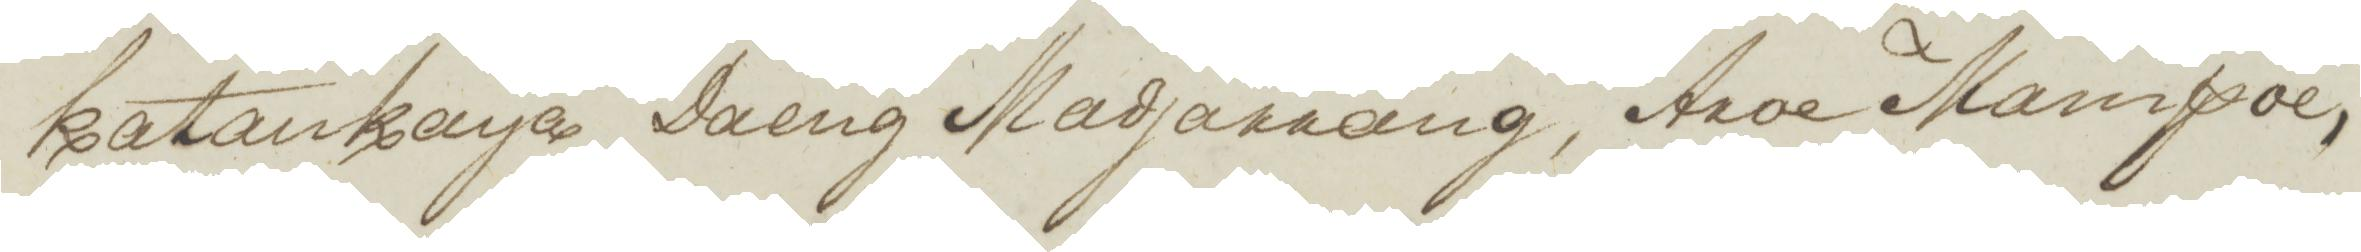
katankaija Daeng Madjarrang, Aroe Mampoe,
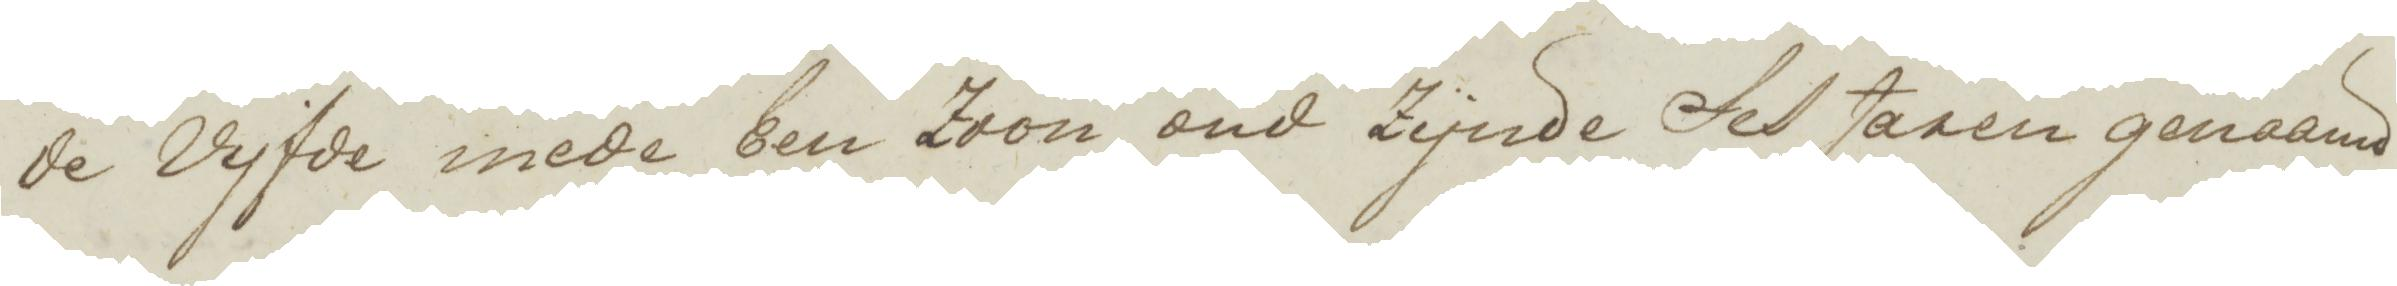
de vijfde mede Een zoon oud zijnde Ses Jaren genaamd
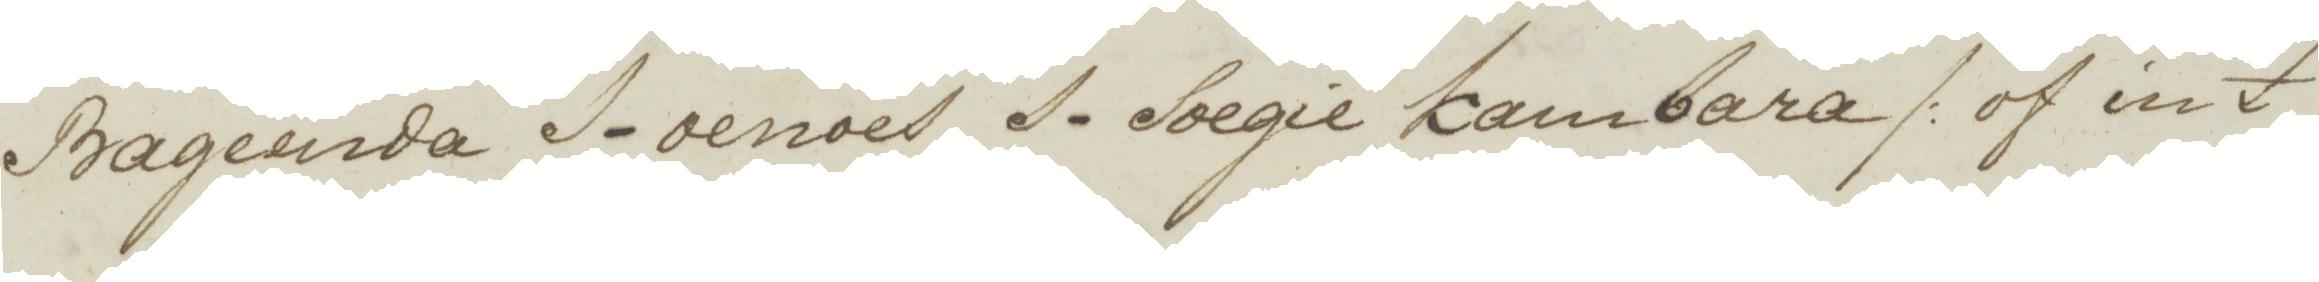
Bageenda I-oenoes I-soegie kambara /: of in ’t
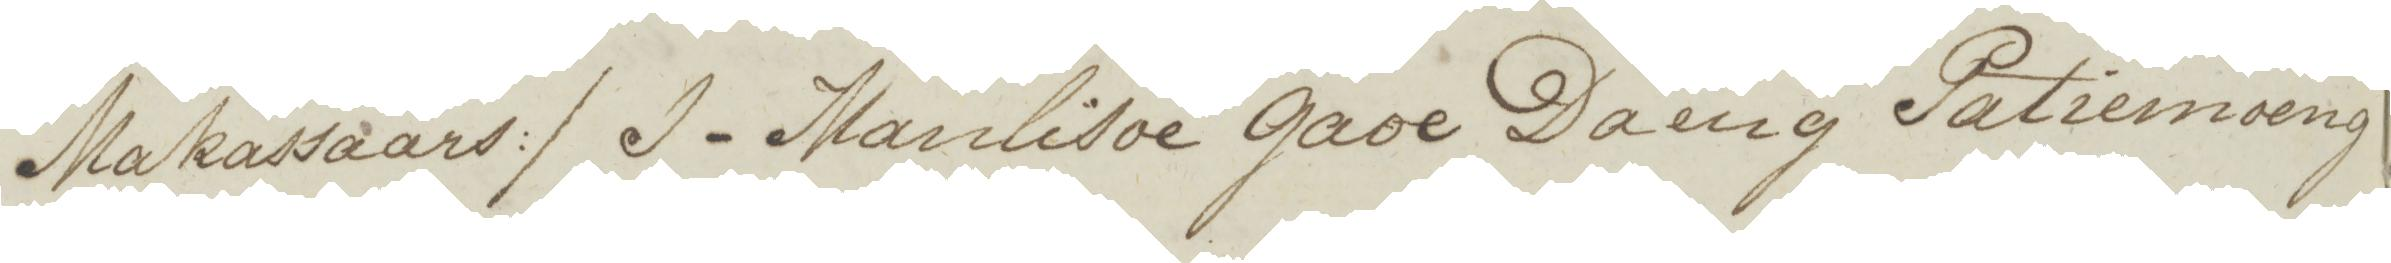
Makassaars:/ I-Manlisoe gaoe Daeng Patiemoeng
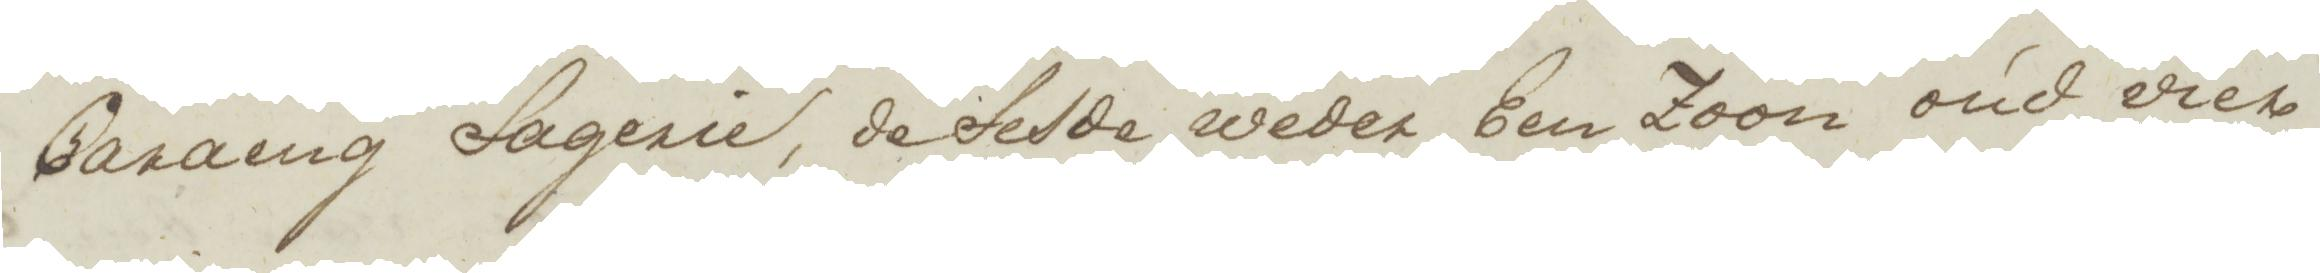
Paraeng sagerie, de sesde weder Een zoon oud vier
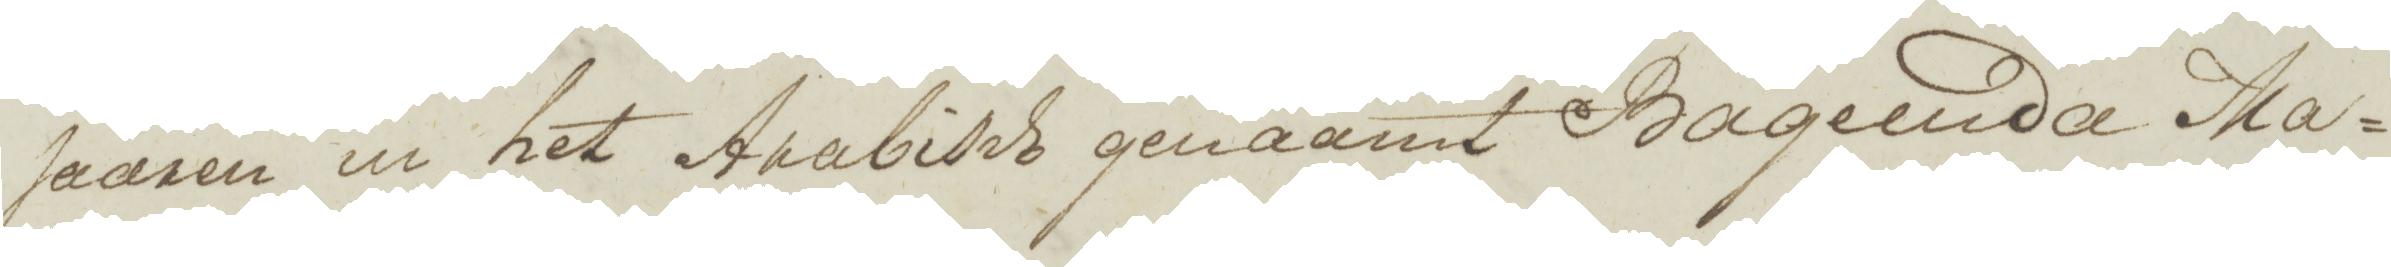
jaaren in het Arabisch genaamt Bageenda Ma=
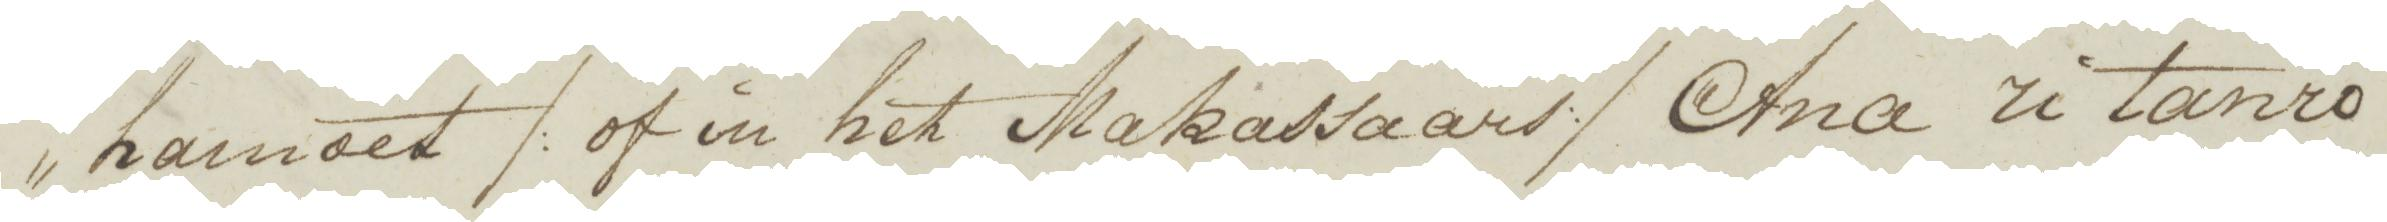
„hamoet /: of in het Makassaars :/ Ana ri tanro
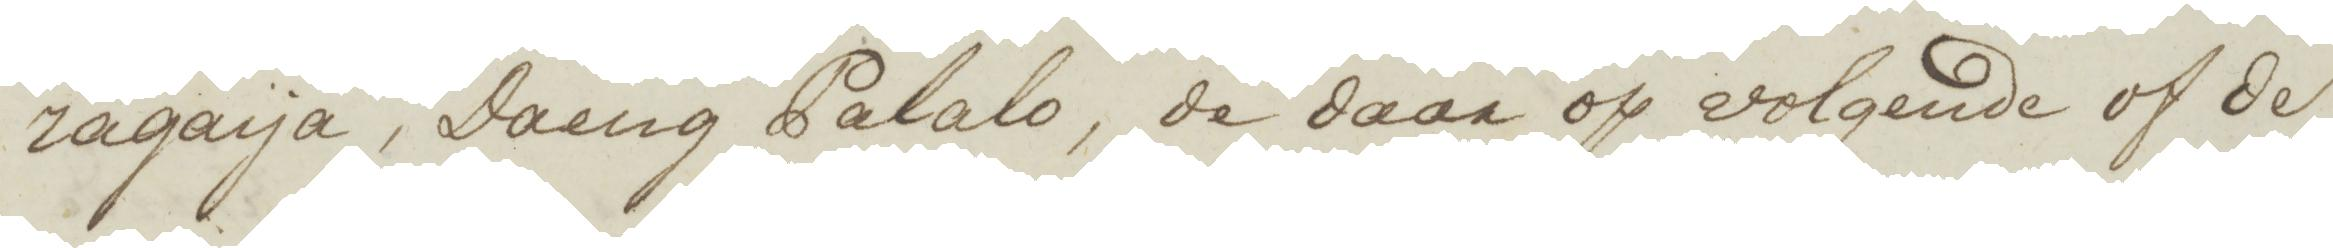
ragaija, Daeng Palalo, de daar op volgende of de
